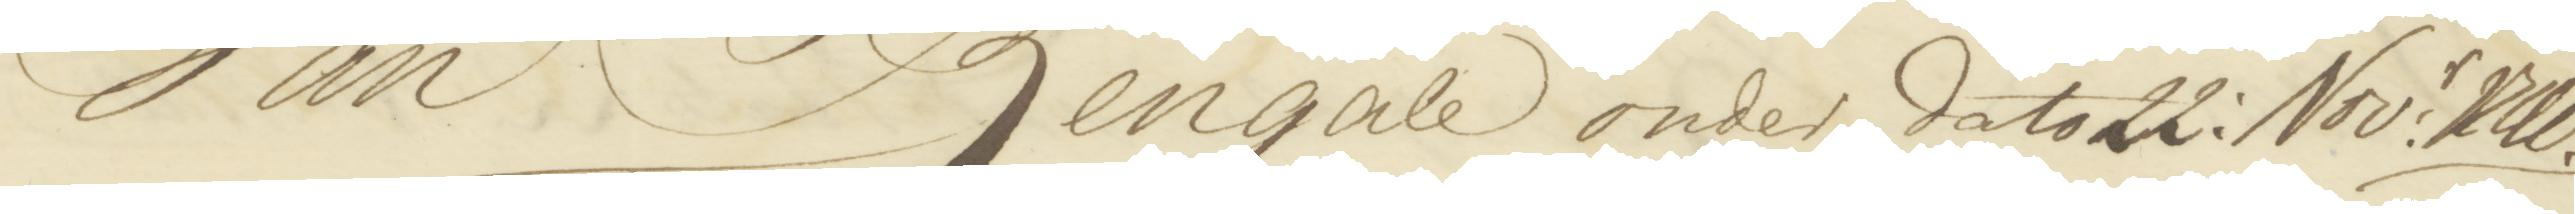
Van Bengale onder dato 22:' Nov:r 1740
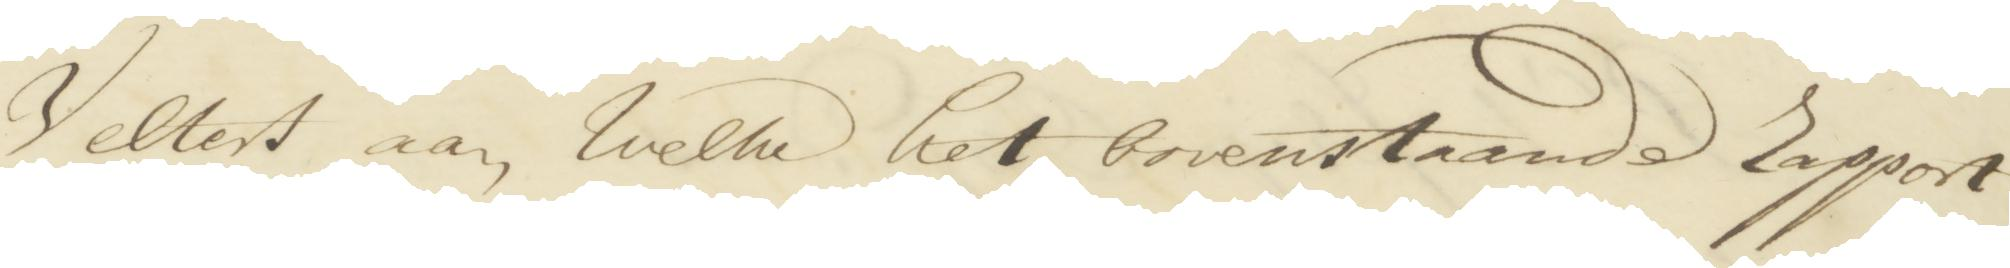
Velters aan welke het bovenstaande rapport
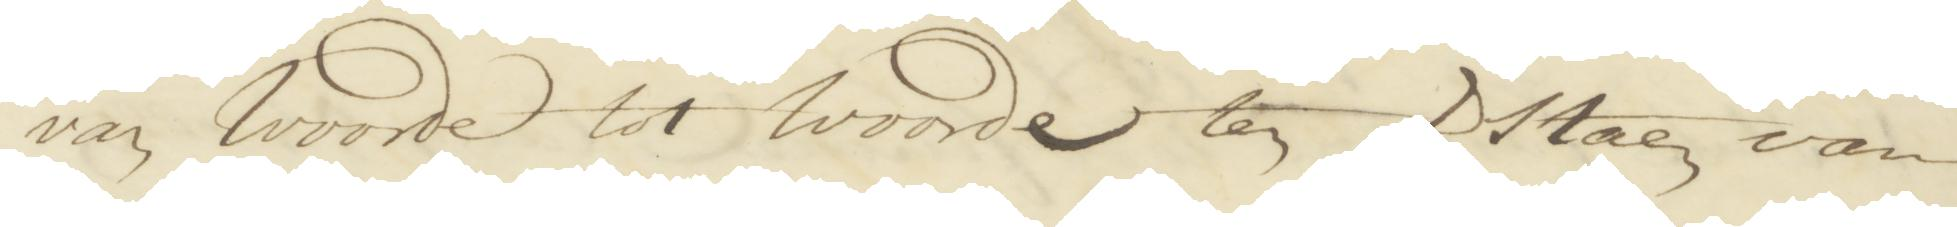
van woorde tot woorde ten overstaen van
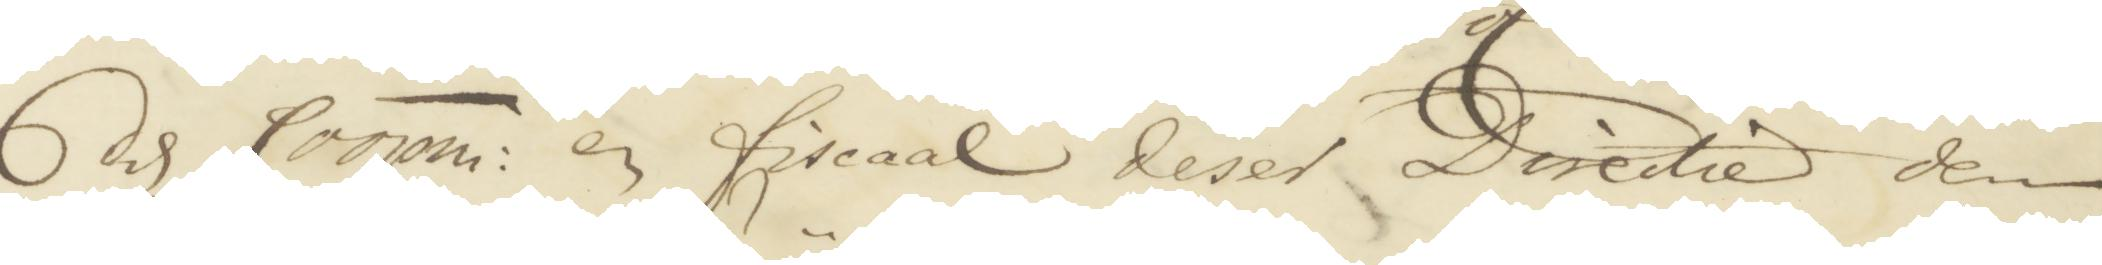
den Coopm: en fiscaal deser Directie den
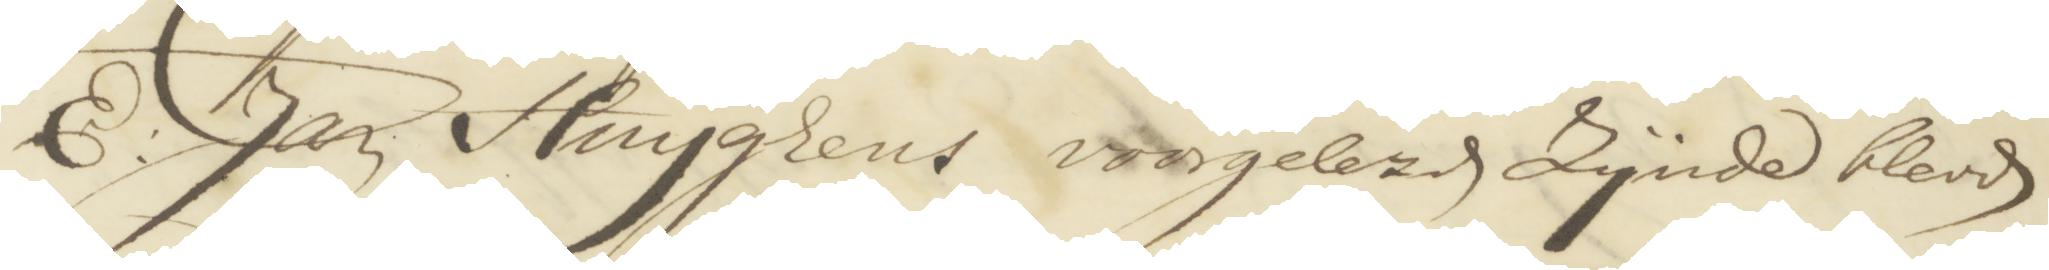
E: Jan Huijghens voorgelezen zijnde bleven
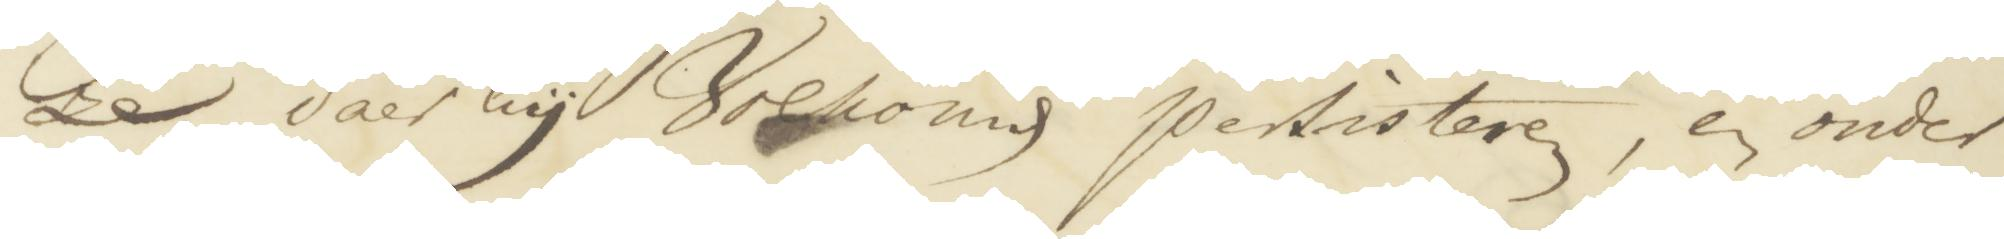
ze daer bij Volkomen persisteren, en onder
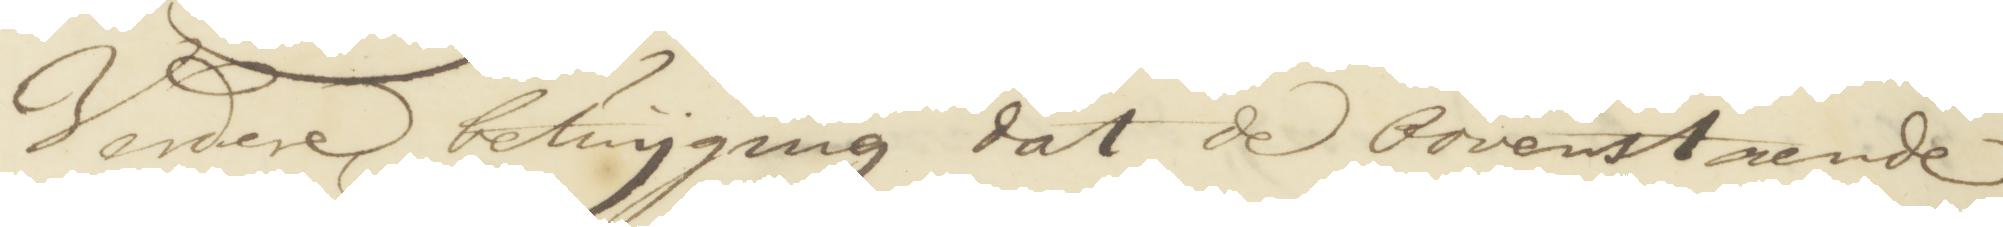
Verdere betuijging dat de bovenstaende
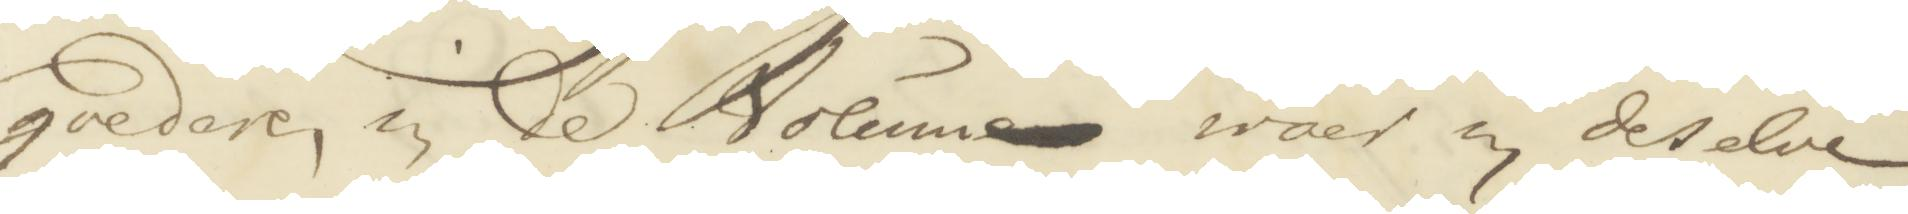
goederen in de Volume waer in deselve
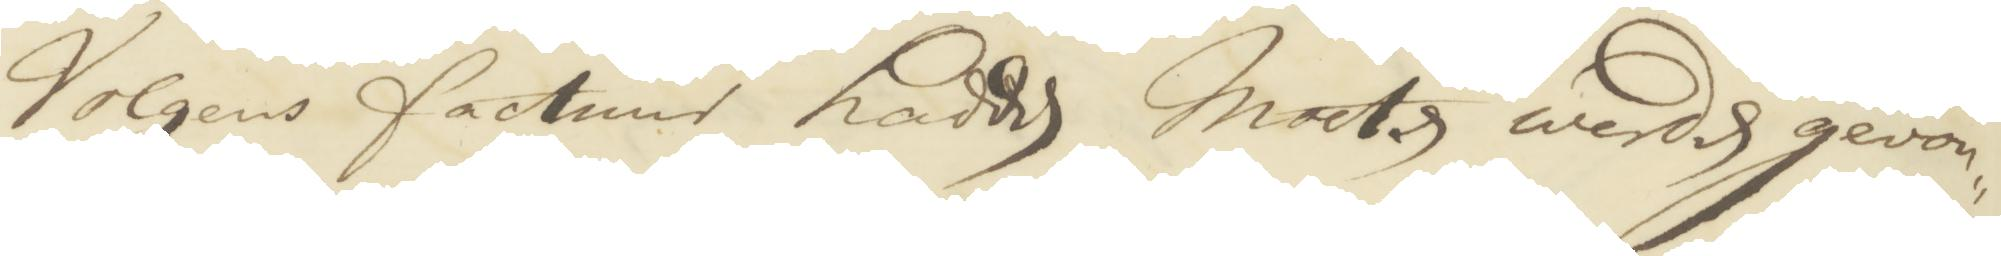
Volgens factuur hadden moeten werden gevon„
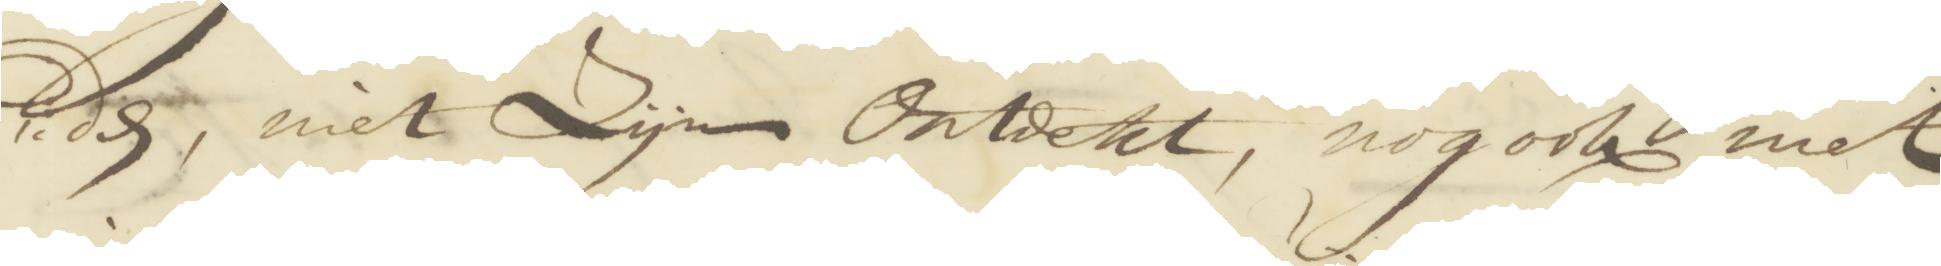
den, niet Zijn ontdekt, nog ook niet
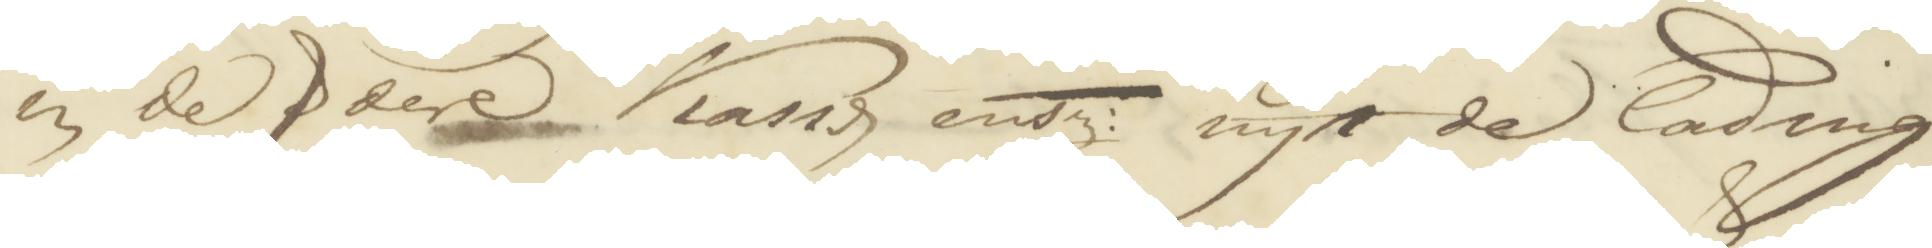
in de verdere Kassen ensen: uijt de lading
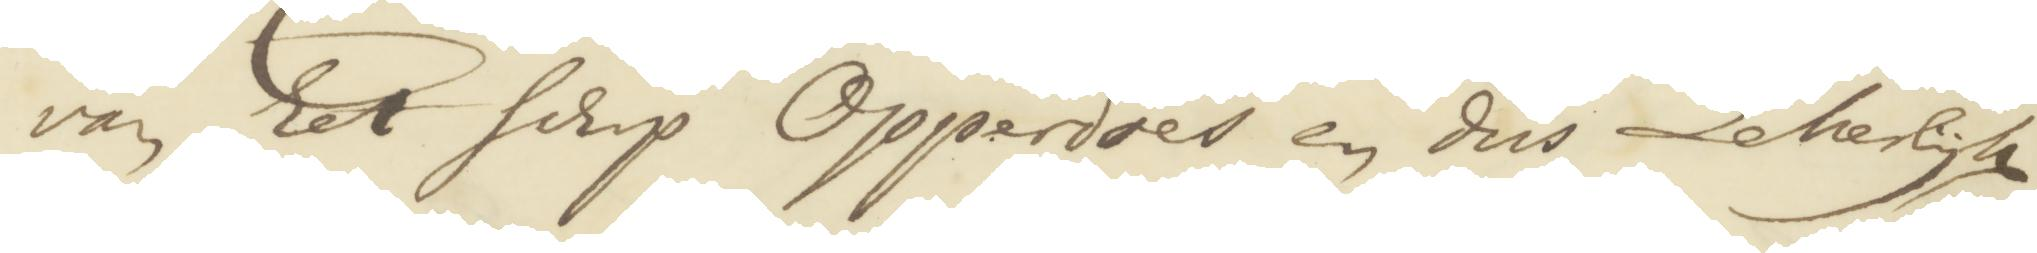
van het schip Opperdoes en dus Zekerlijk
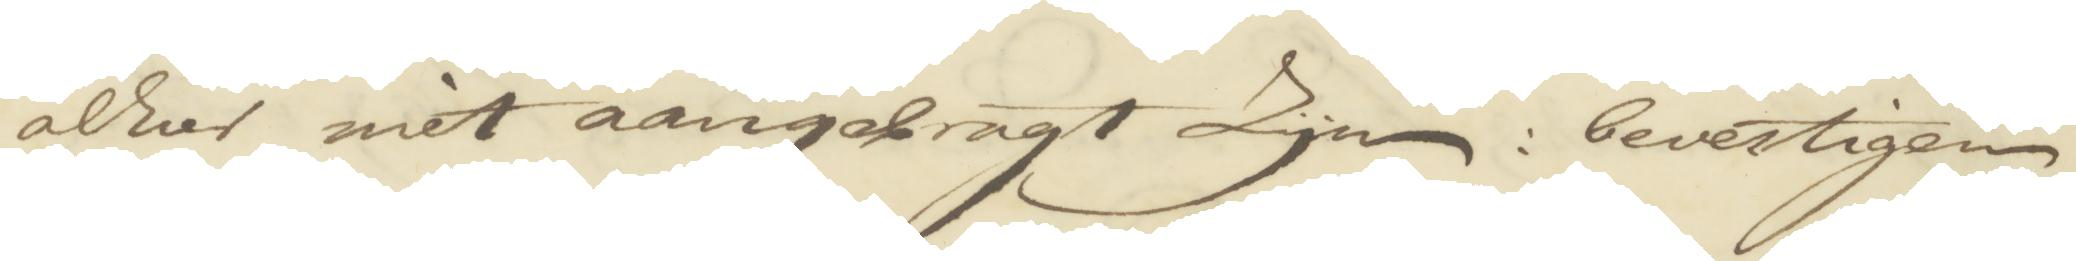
alhier niet aangebragt Zijn: bevestigen
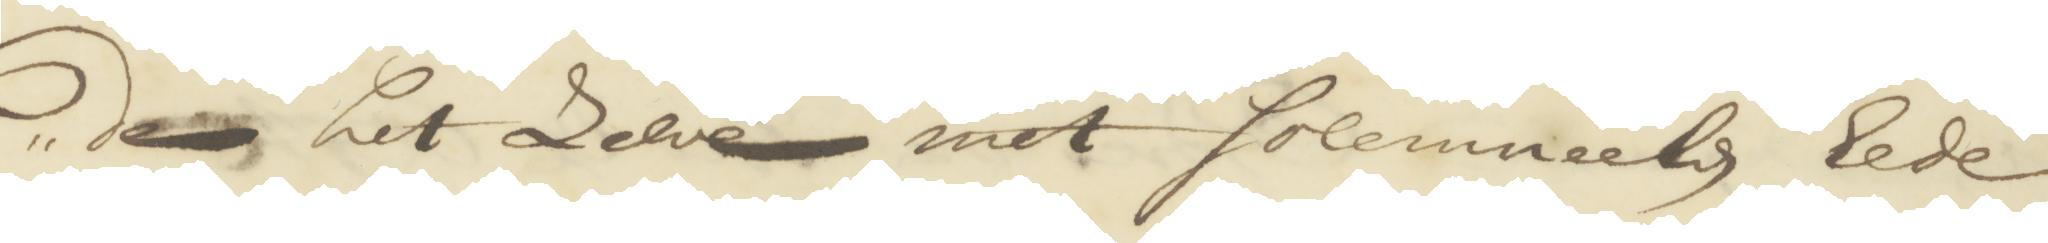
„de het zelve met solemneelen Eede
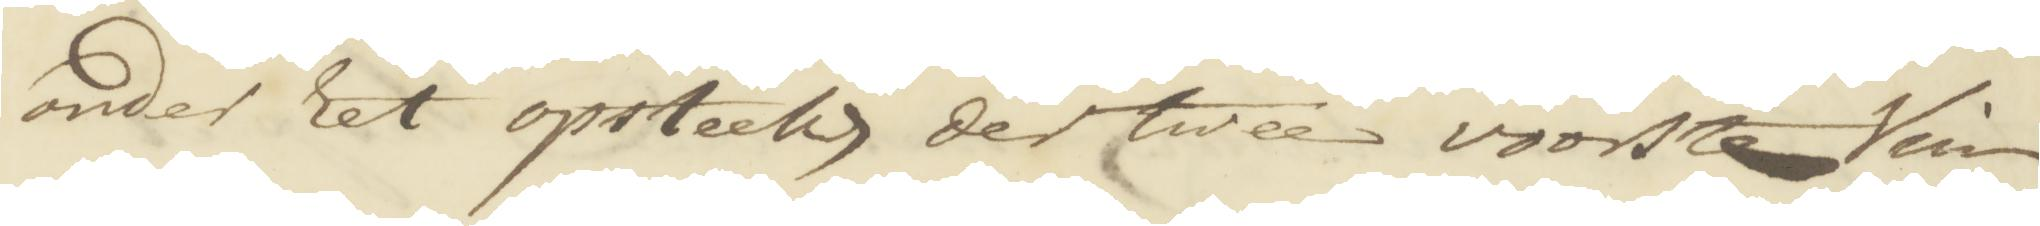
onder het opsteeken der twee voorste Vin
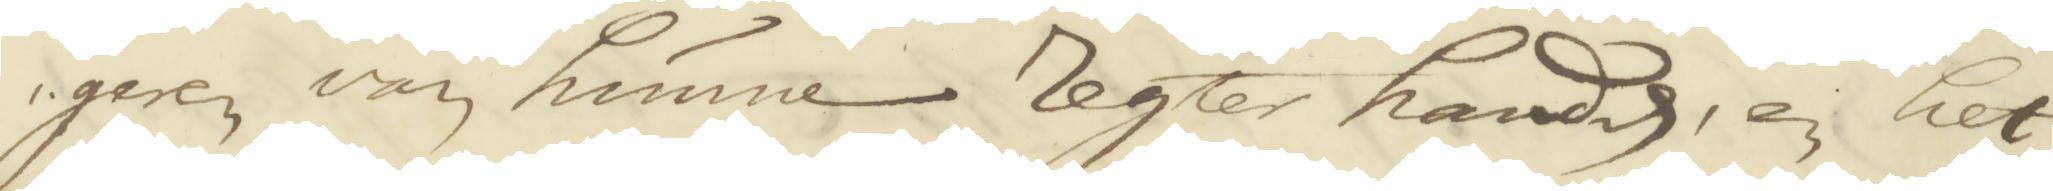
„geren van hunne regter handen, en het
